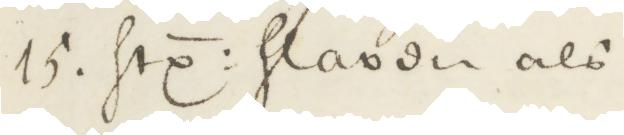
15. stx: slaven als
